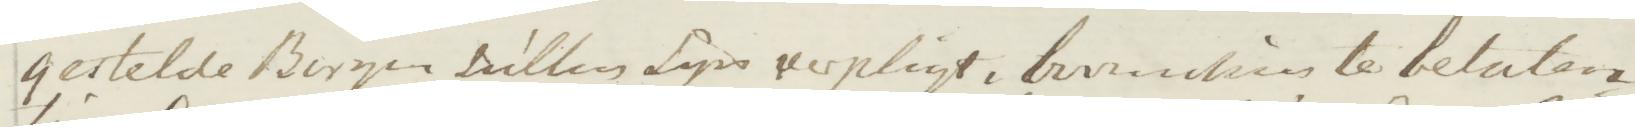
gestelde Borgen zullen zijn verpligt, bovendien te betalen
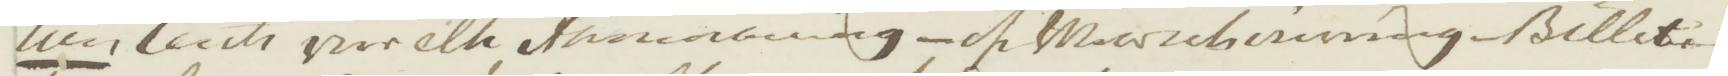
tien Cents voor elk Aanmaning - of Waarschuwings Billet,
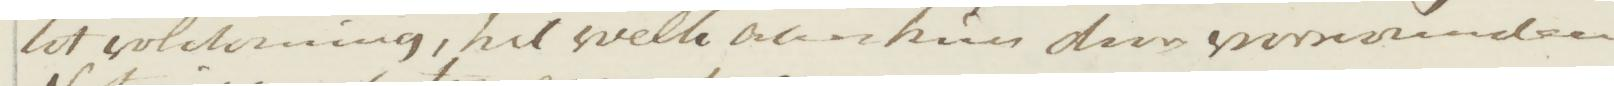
tot voldoening, het welk aan hun door voornoemde
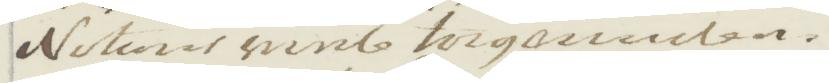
Notaris werde toegezonden.
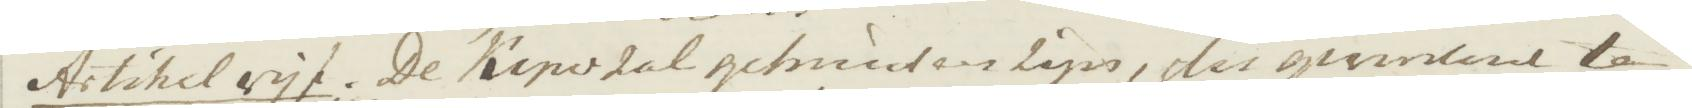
Artikel vijf. De Koper zal gehouden zijn, des gevorderd te
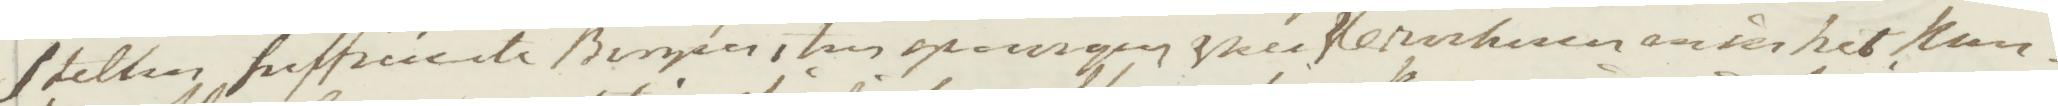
stellen, sufficiente Borgen, ten genoegen van Kornhuren en in het kan
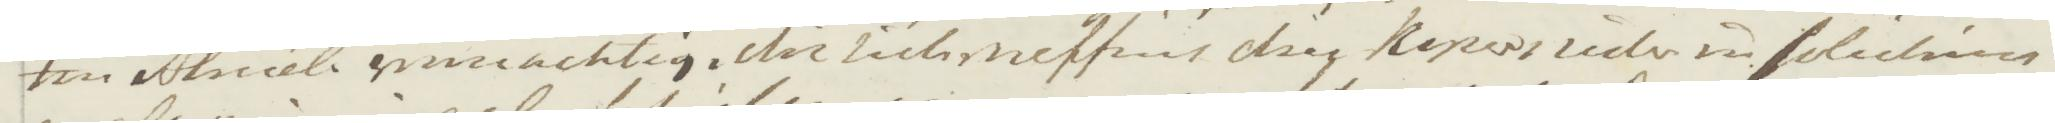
ton Almelo woonachtig, die zich neffens dien kopers, ieder in solitimus
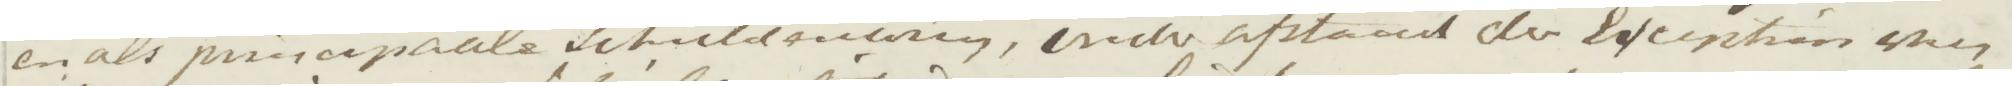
en als principaale schuldenaren, onder afstand der Exceptien van
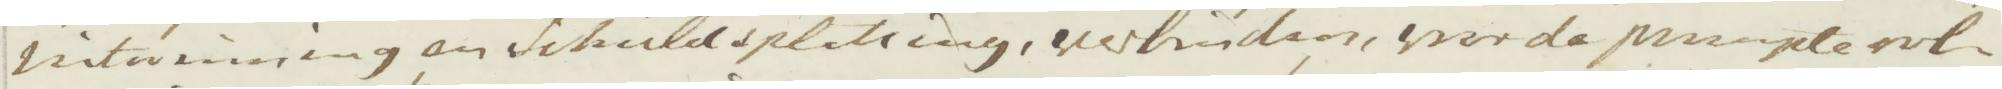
uitwinning en schuldsplitsing, verbinden, voor de prompte vol
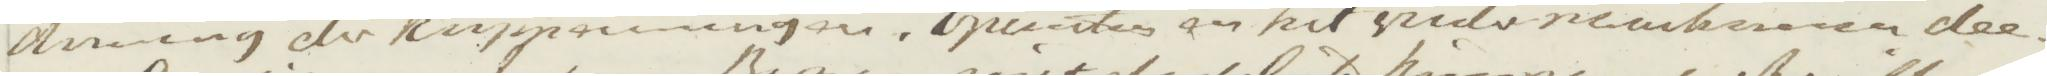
doening der kooppenningen, opcenten en het geede van komen dee.
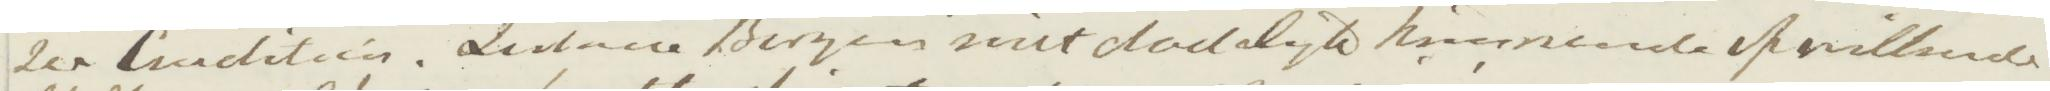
zer Conditien, Zestane Borgen niit dadelijk kunnende op willende
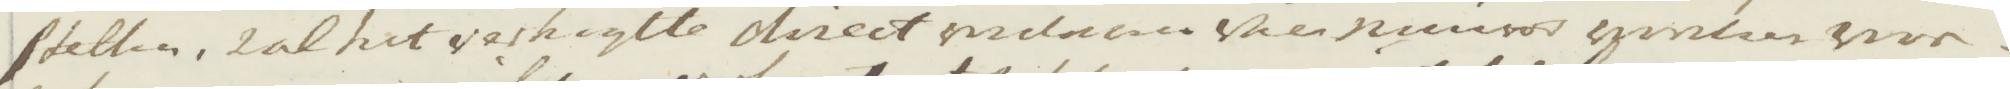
stellen, zal het verkogtte direct gedaan weer nieuwt worden voor
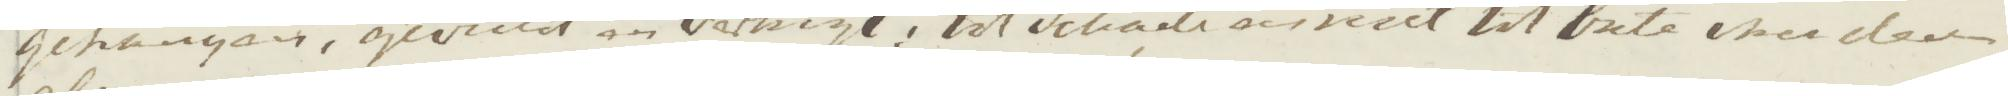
gehangen, geveild en verkogt, tot schade om niet tot bate overdaar
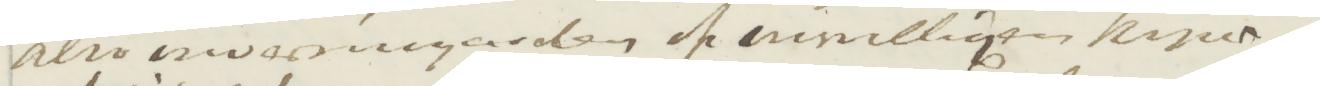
also onvermogenden of onwilligen koper.
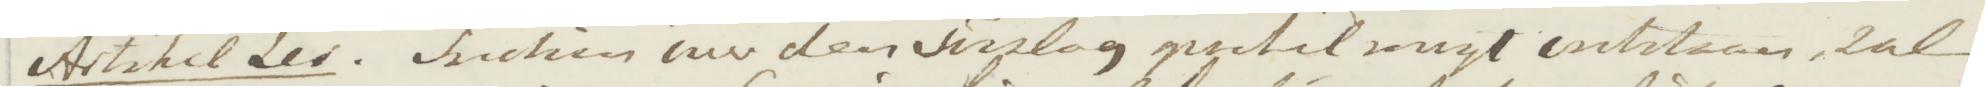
Artikel Zes. Indien om den Toeslag geschil mogt ontstaan, zal
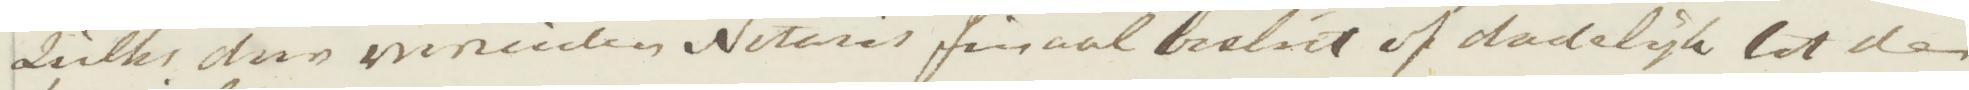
zulks door voorzeiden Notaris finaal besluit of dadelijk tot de
